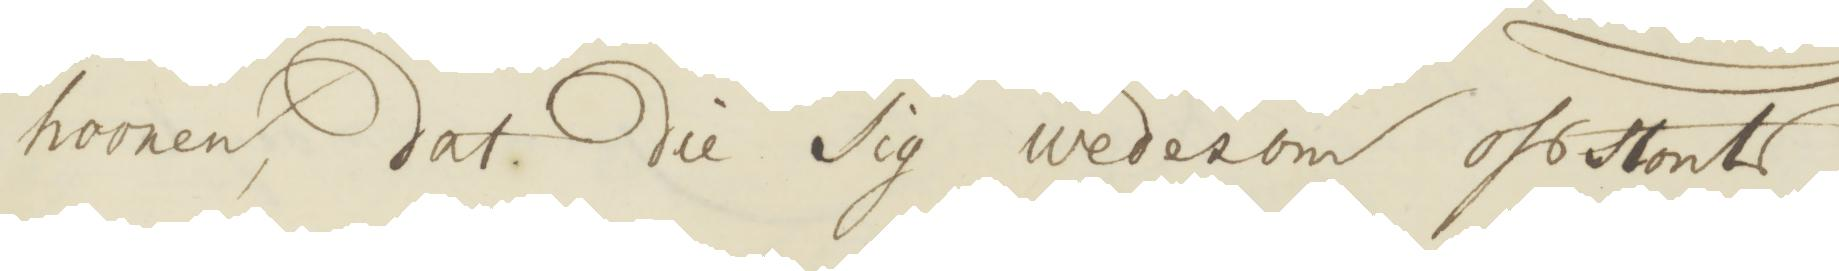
hooren, dat die sig wederom opstonts
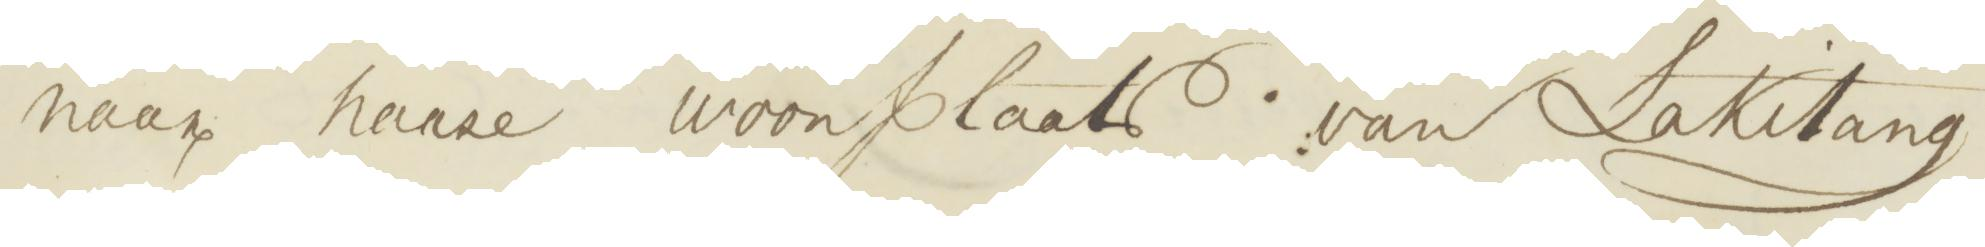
naar haare woonplaats van Sakitang
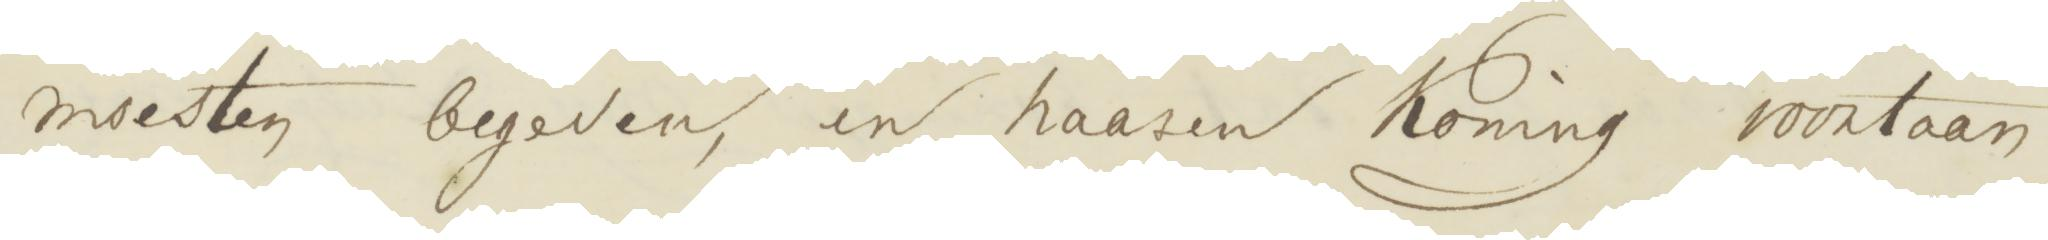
moesten begeven, en haaren koning voortaan
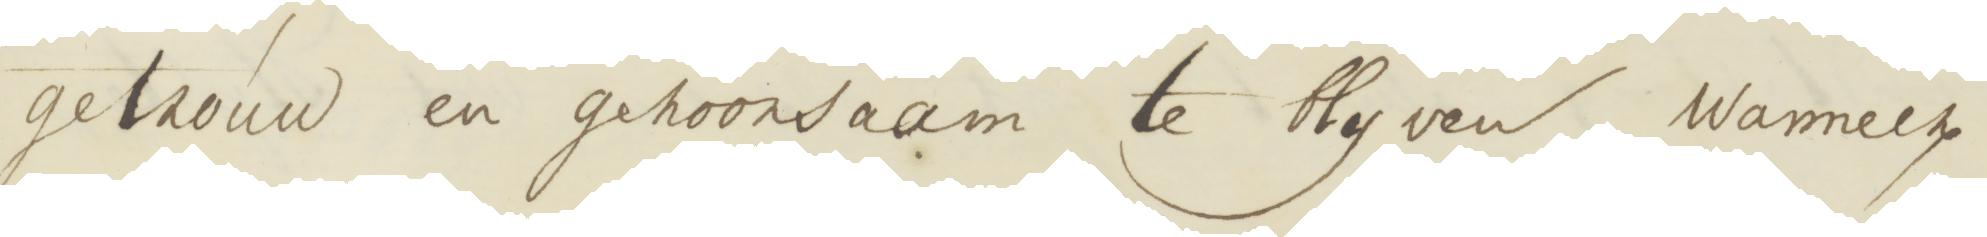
getrouw en gehoorsaam te blyven, wanneer
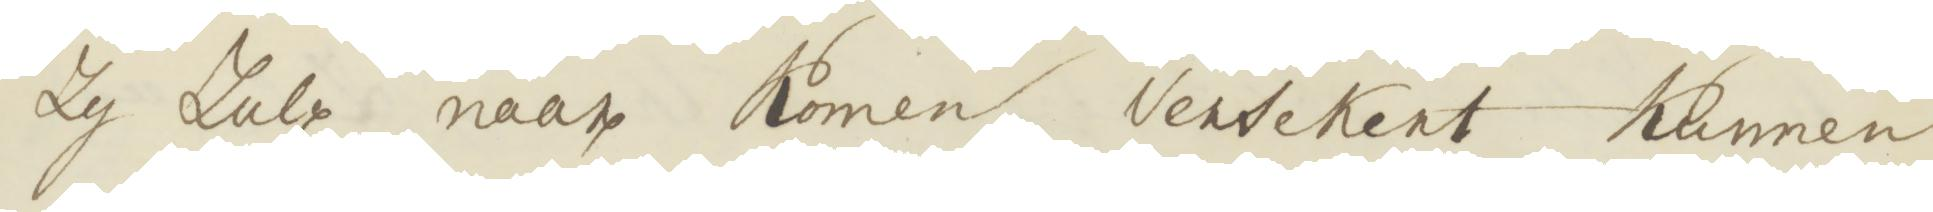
zy zulx naar komen, versekert kunnen
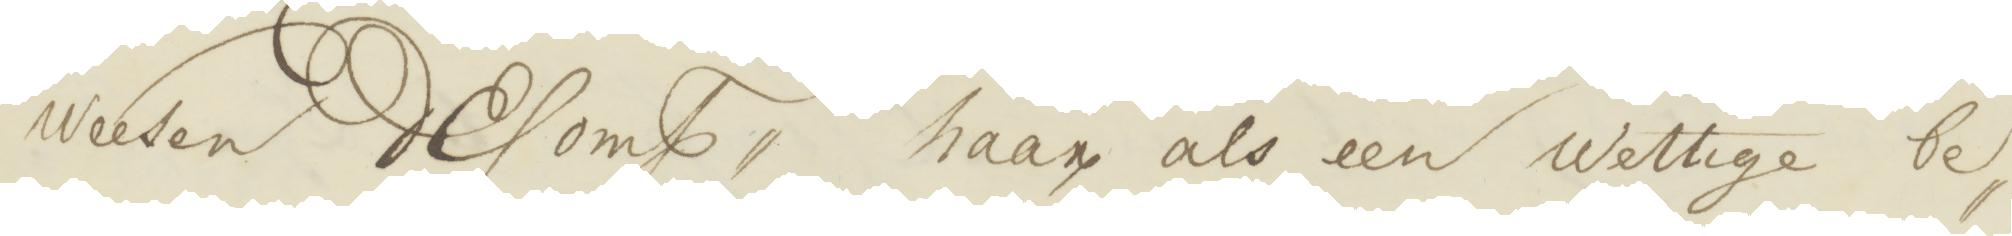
weesen d E Comp„e haar als een wettige be
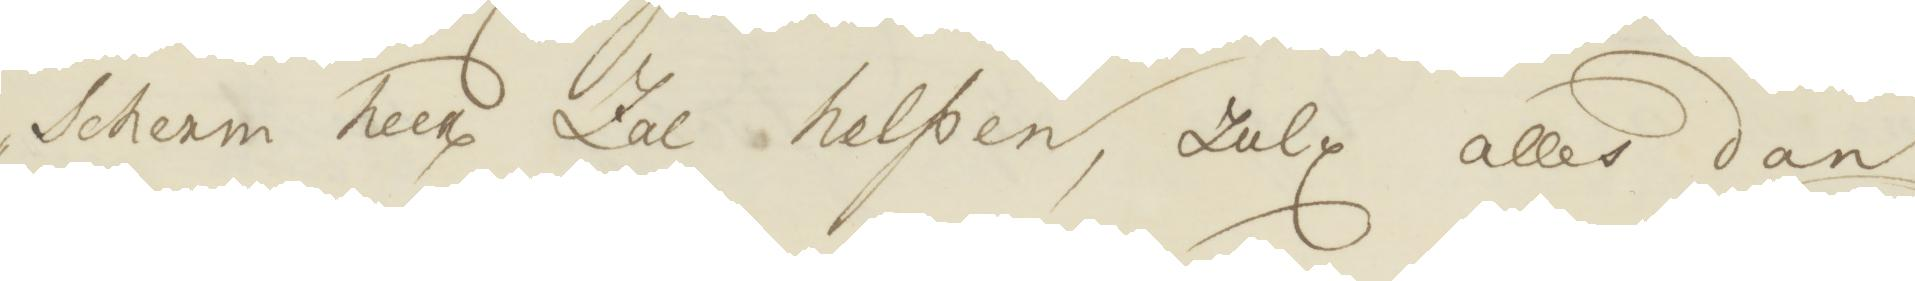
„scherm heer Zal helpen, zulx alles dan
